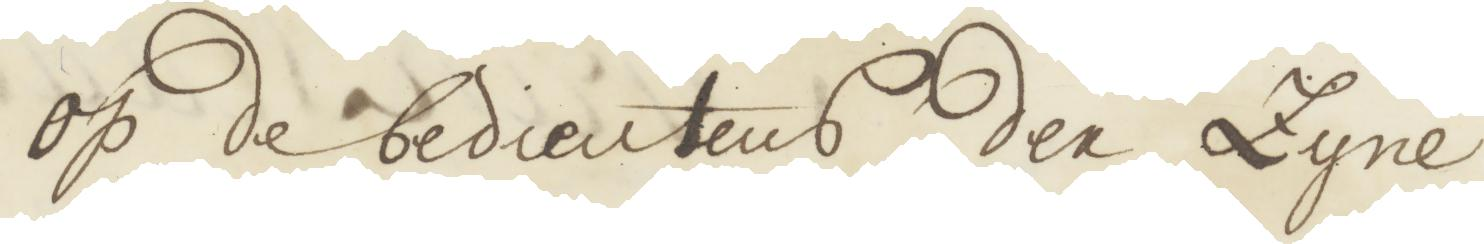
op de bedientens der Zyne
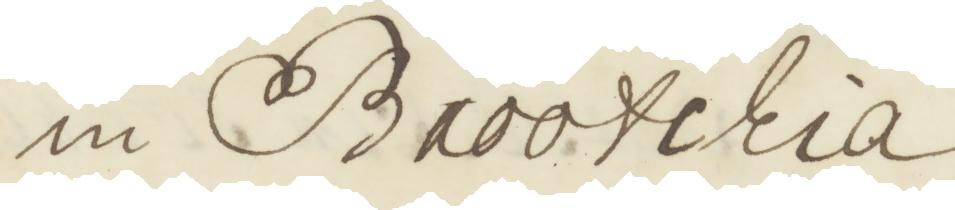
in Brootchia
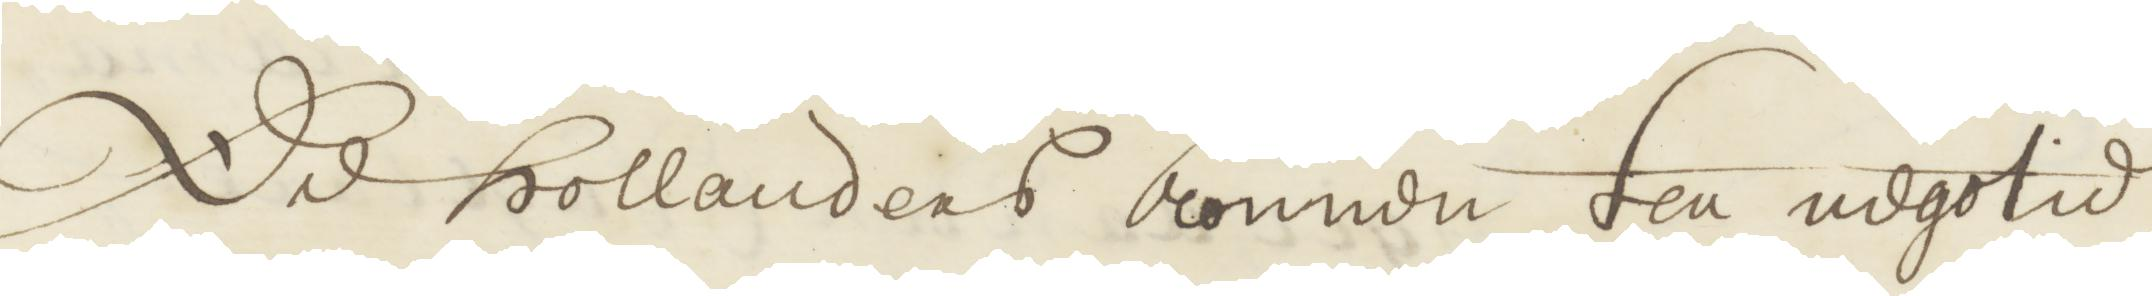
De hollanders konnen ter negotie
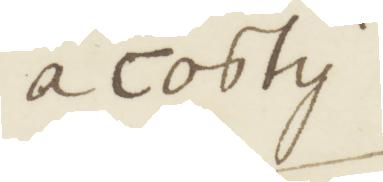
â costij
